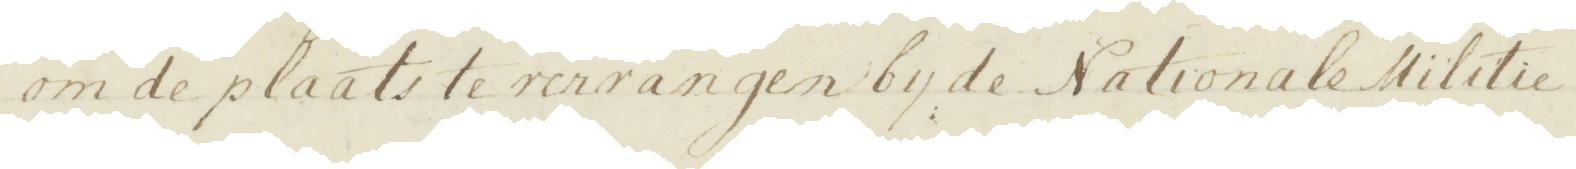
om de plaats te vervangen by de Nationale Militie
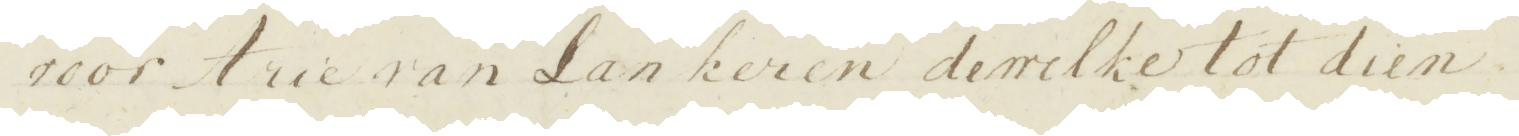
voor Arie van Lankeren dewelke tot dien
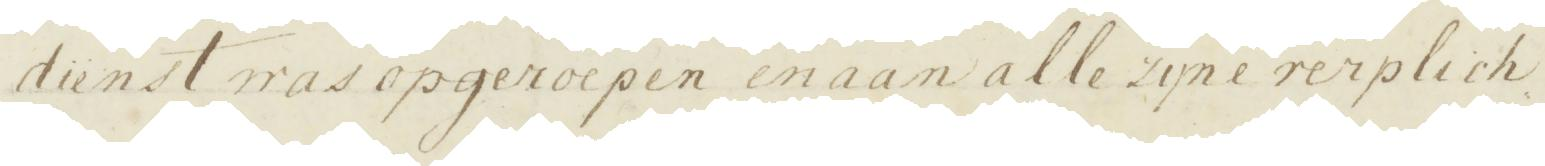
dienst was opgeroepen en aan alle zyne verplich„
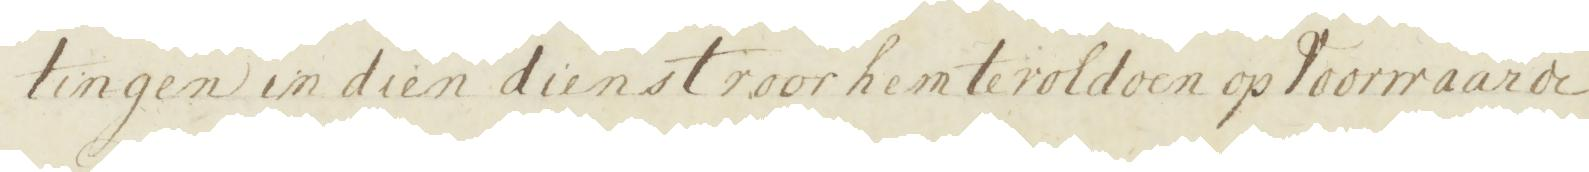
tingen in dien dienst voor hem te voldoen op Voorwaarde
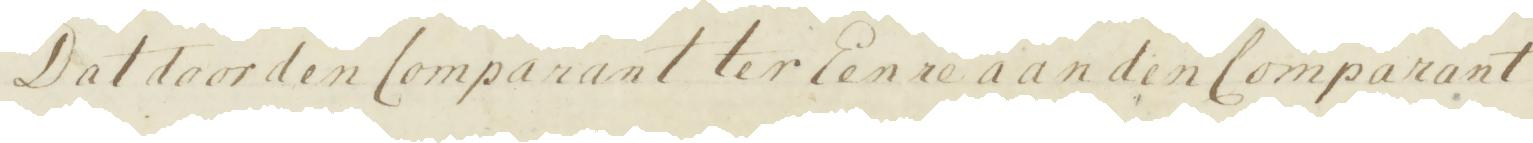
Dat door den Comparant ter Eenre aan den Comparant
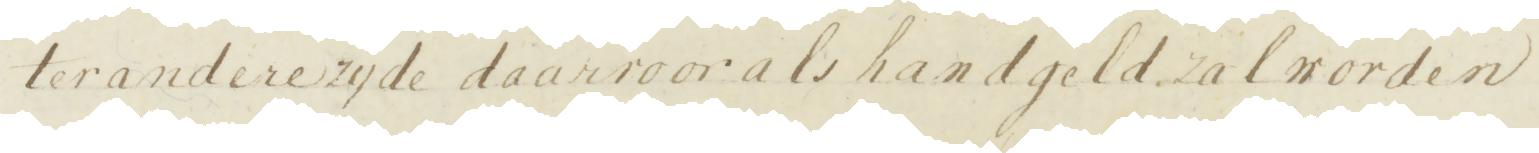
ter andere zyde daarvoor als handgeld zal worden
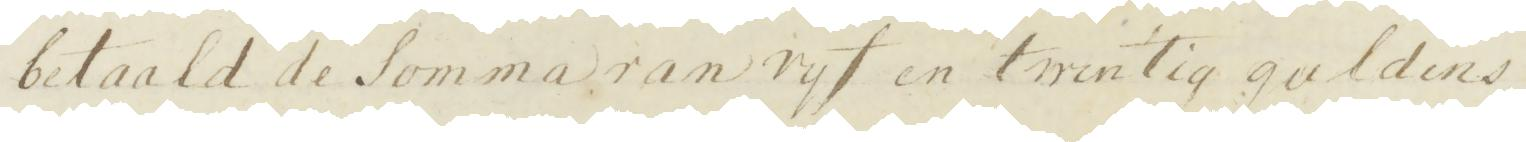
betaald de somma van vyf en twintig guldens
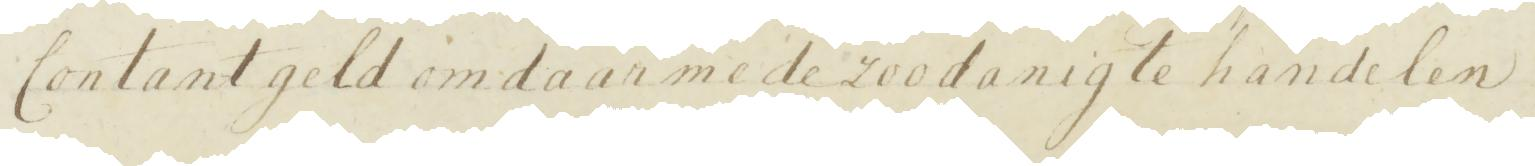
Contant geld om daar mede zoodanig te handelen
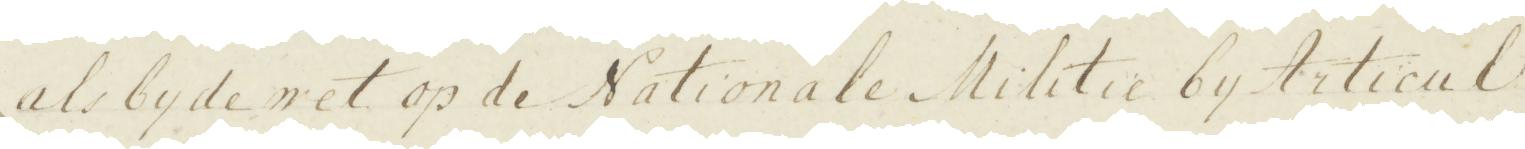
als by de wet op de Nationale Militie bij Articul
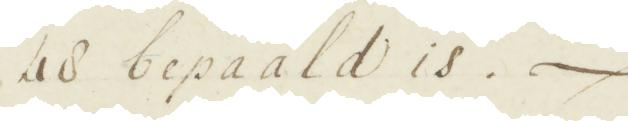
48 bepaald is . —
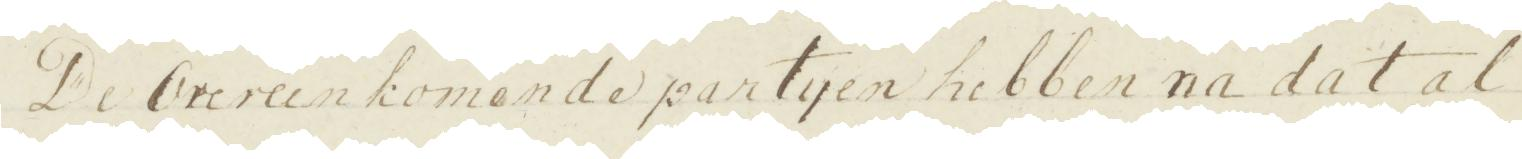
De Overeenkomende partyen hebben na dat al
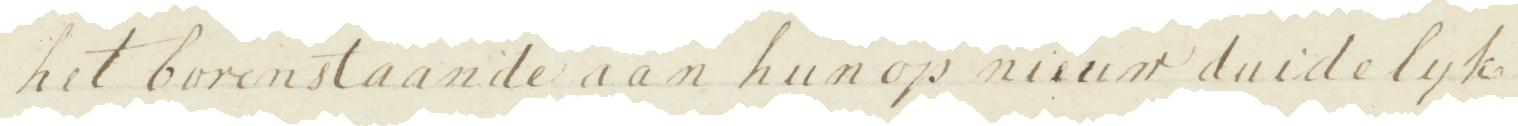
het bovenstaande aan hun op nieuw duidelyk
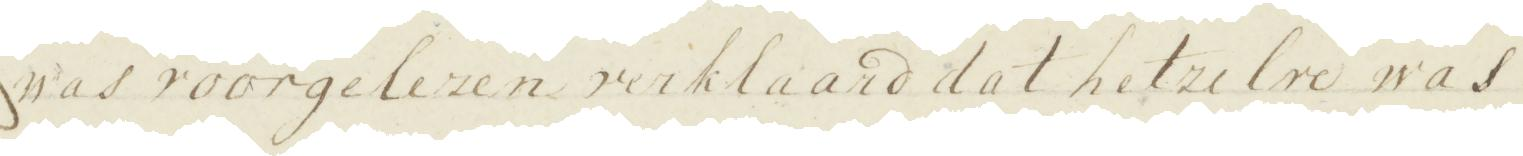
was voorgelezen verklaard dat hetzelve was
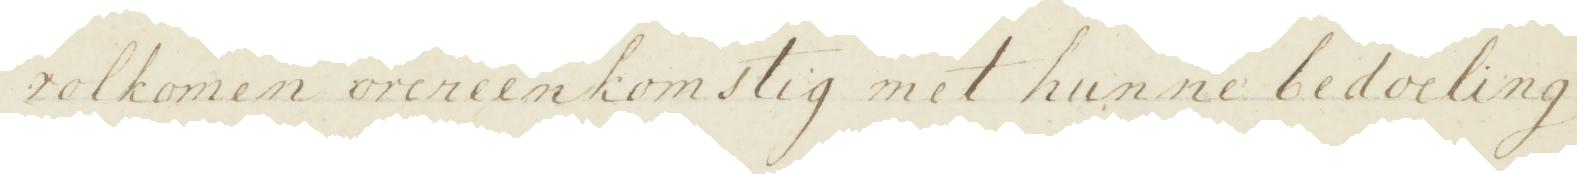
volkomen overeenkomstig met hunne bedoeling
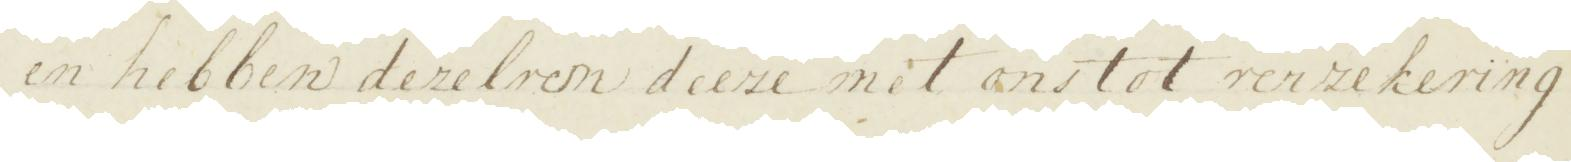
en hebben dezelven deeze met ons tot verzekering
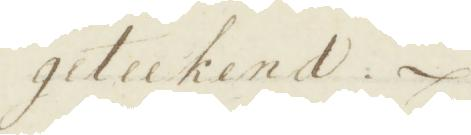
geteekend . —
